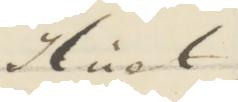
Huet
